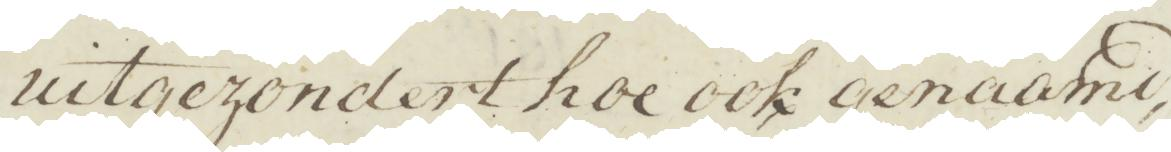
uitgezondert hoe ook genaamt,
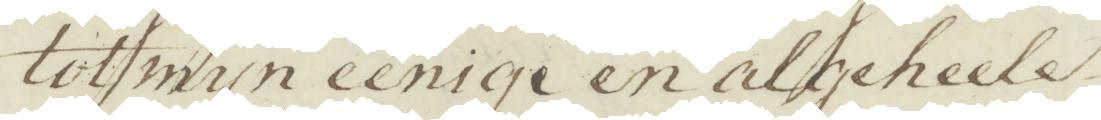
tot myn eenige en algeheele
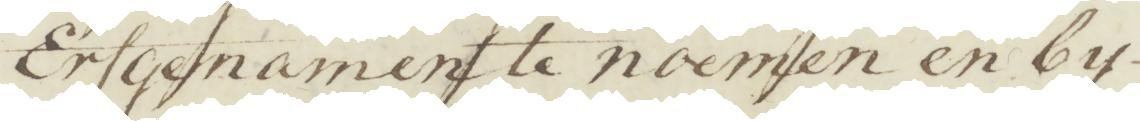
Erfgenamen te noemen en by
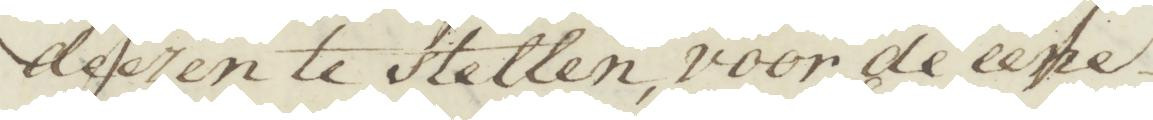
deezen te stellen, voor de eene
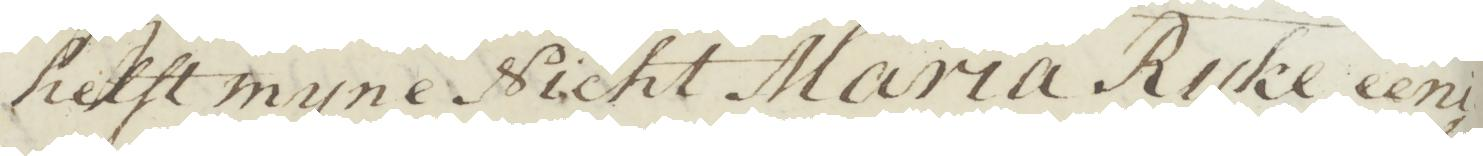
helft myne Nicht Maria Ryke, eeni
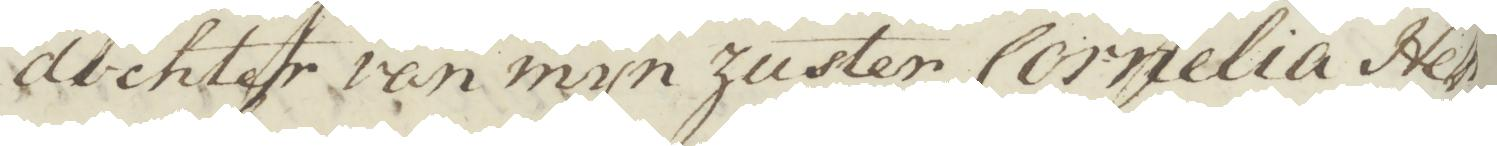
dochter van myn zuster Cornelia Hen
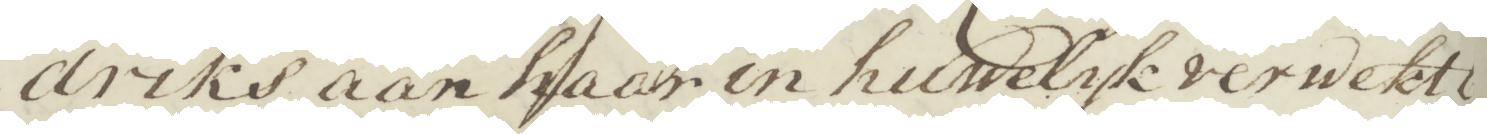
„driks, aan haar in huwelyk verwekt
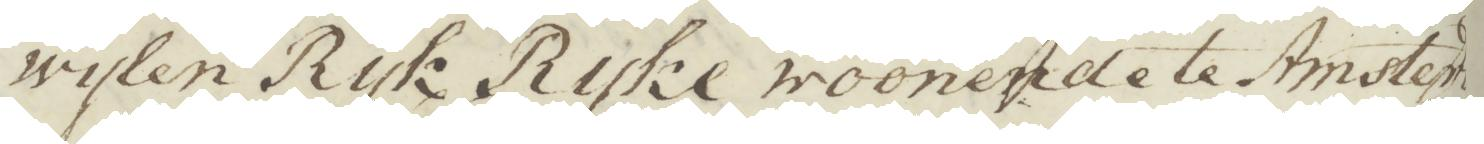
wylen Ryk Ryke, woonende te Amster
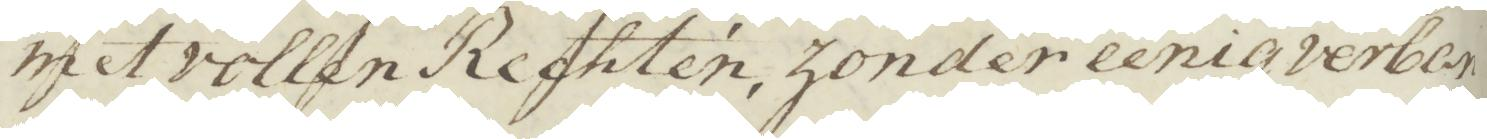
met vollen Rechten, zonder eenig verban
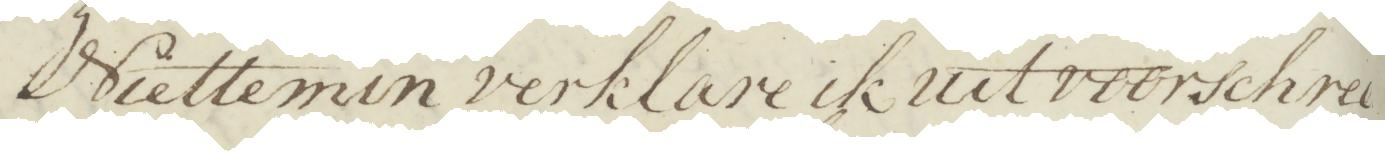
Niettemin verklare ik uit voorschree
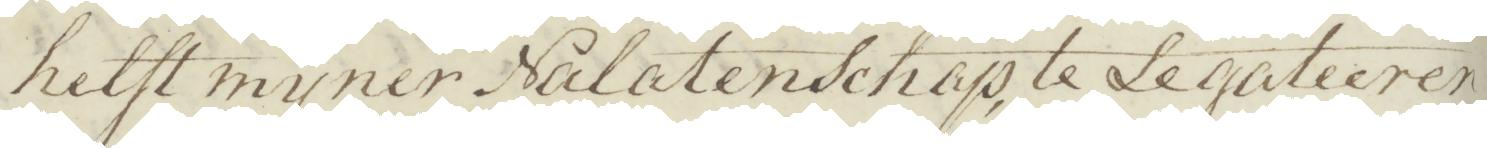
helft myner Nalatenschap te legateeren
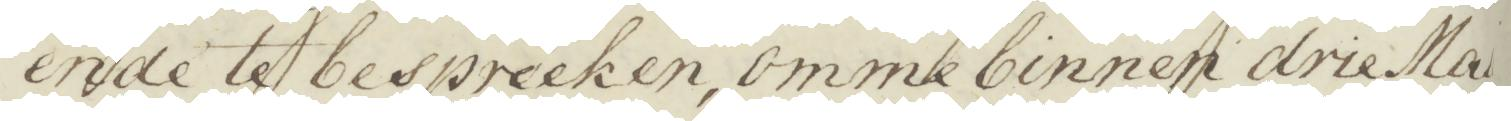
ende te bespreeken, omme binnen drie Ma
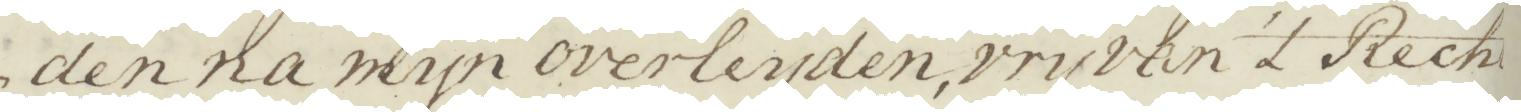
„den na myn overleyden, vry van ’t Rech
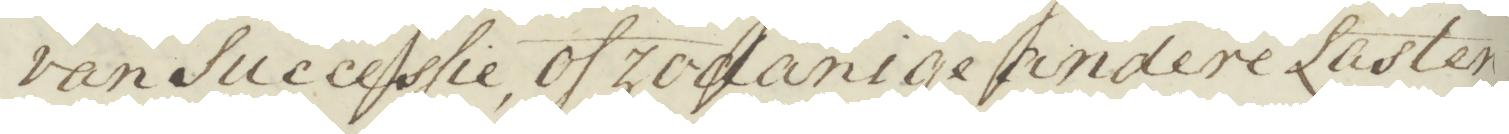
van Successie, of zodanige andere Lasten
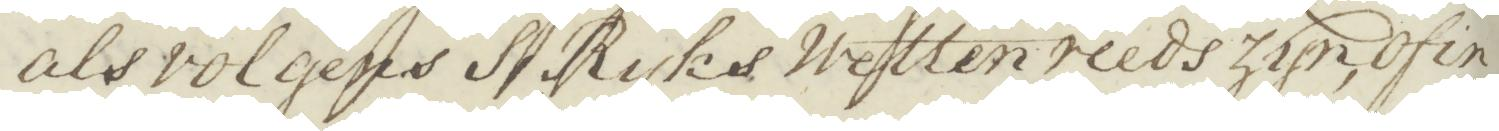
als volgens 'S Ryks Wetten reeds zyn, of in
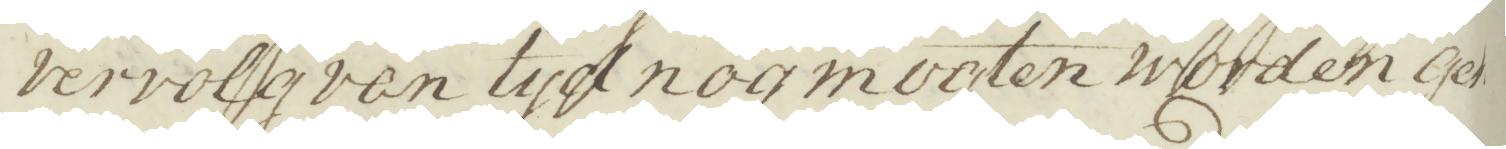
vervolg van tyd nog mogten worden ge
